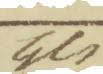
Gls
